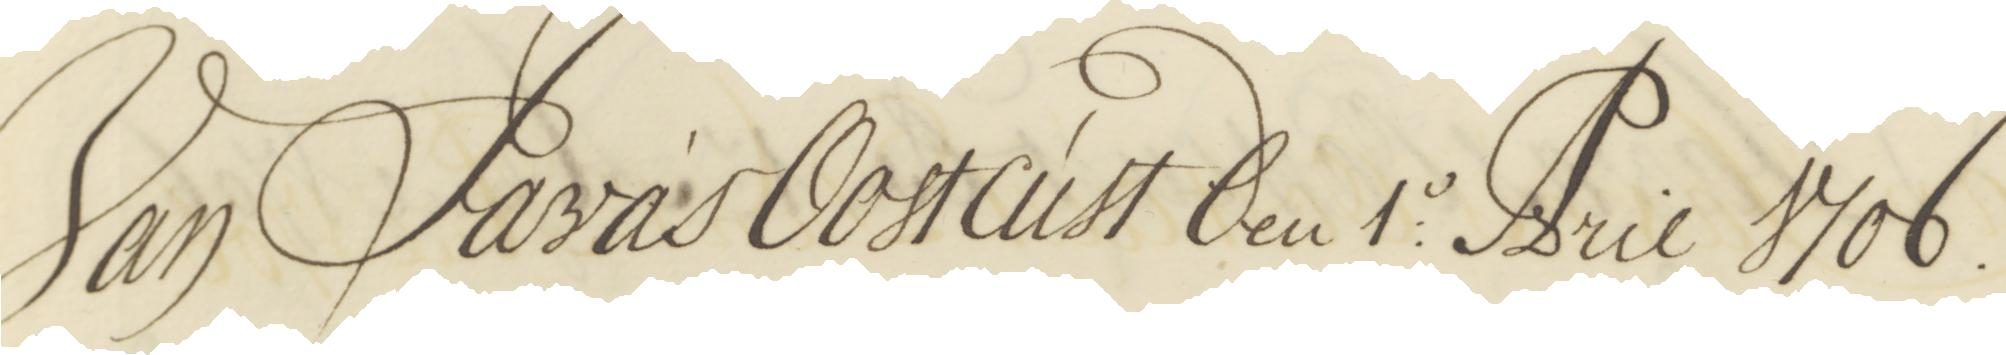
Van Java's Oost cust den 1:e April 1706.
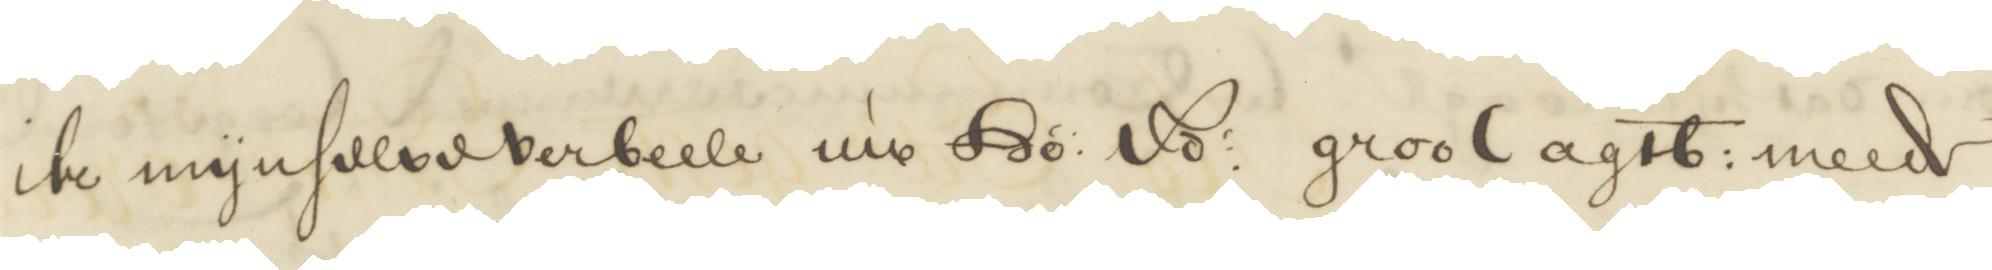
ik mijn selve verbeele uw Ho: Ed: groot agtb: meede
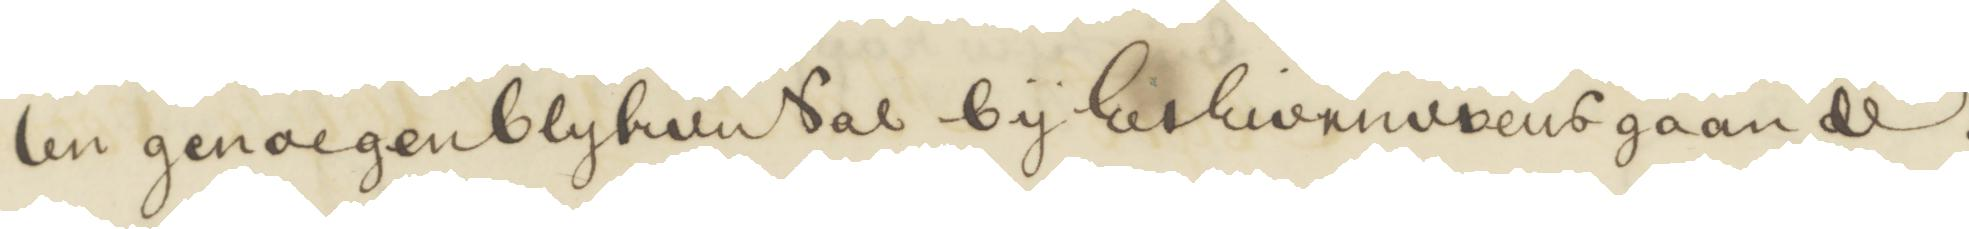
ten genoegen blijken Sal bij het hiernevens gaande
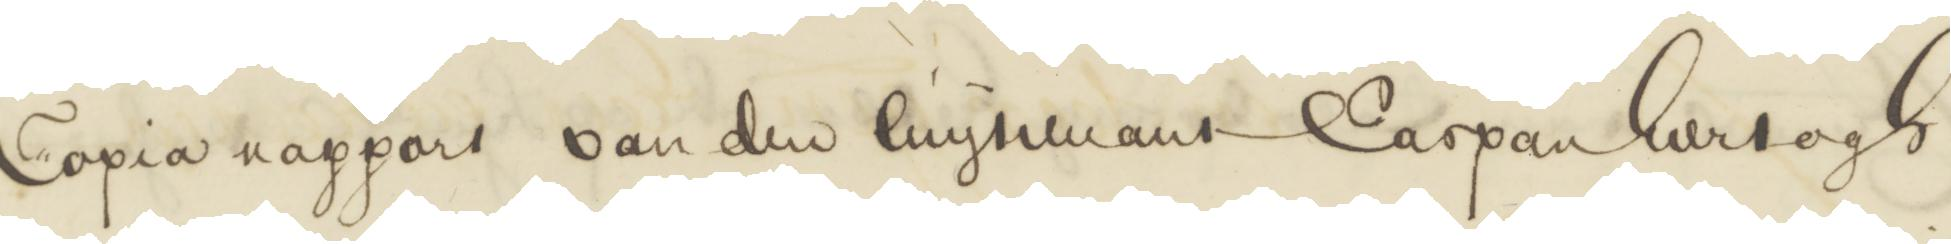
Copia rapport van den luijtenant Caspar hertogh
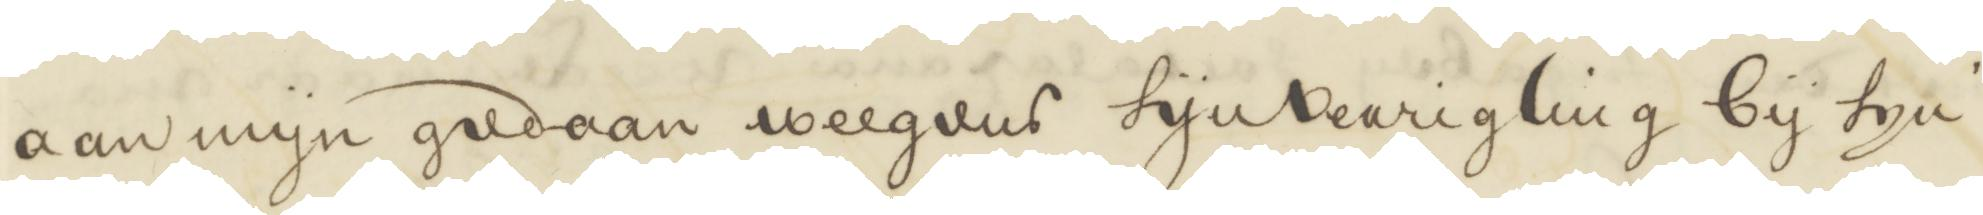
aan mijn gedaan weegens sijn verrigting bij sijn
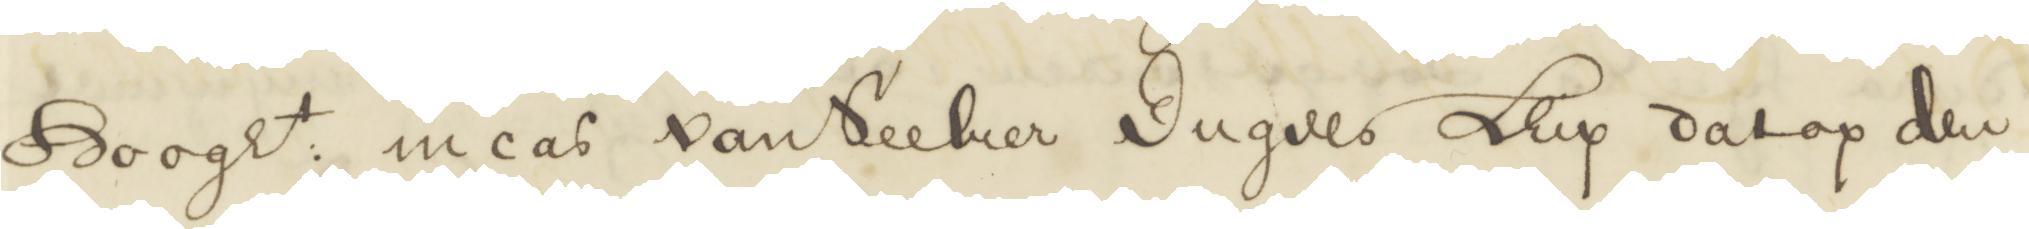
Hoogh:t in cas van Seeker Engels Schip dat op den
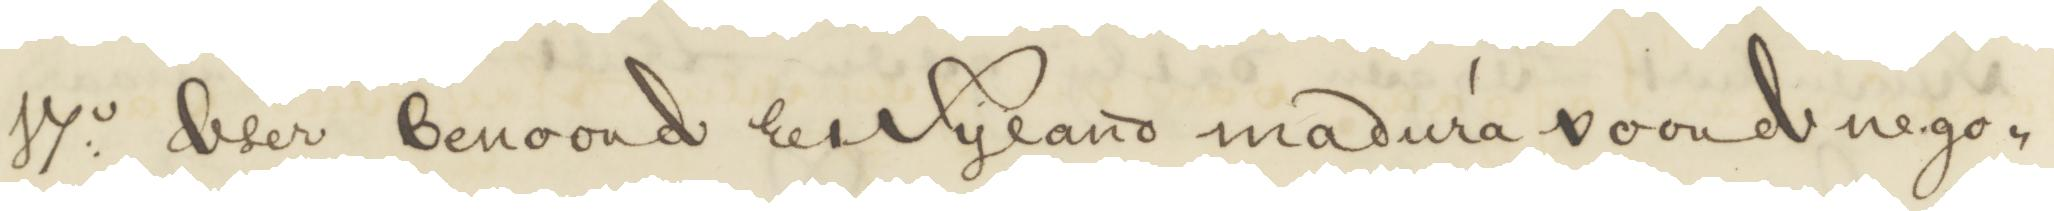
17:e deser benoorde het Eijland madura voor de nego„
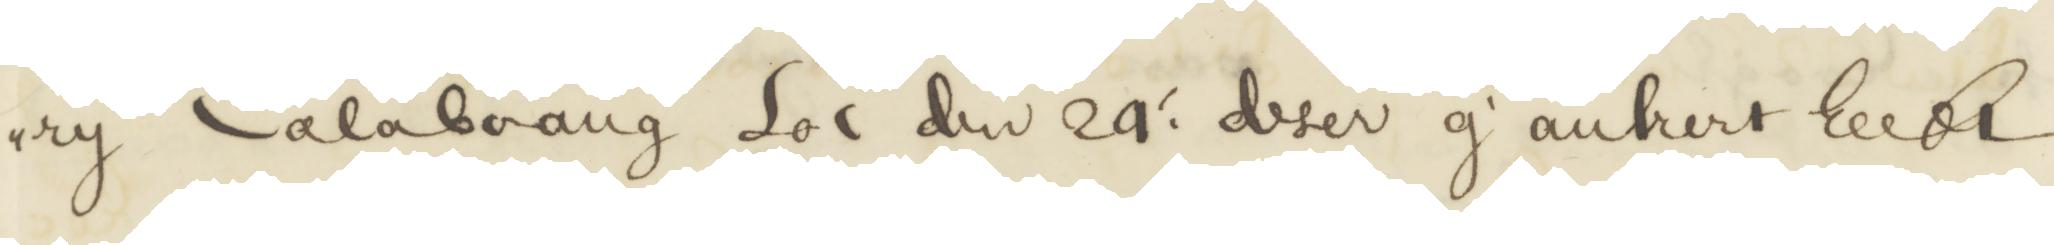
rij Calaboang tot den 24: deser g’ ankert heeft
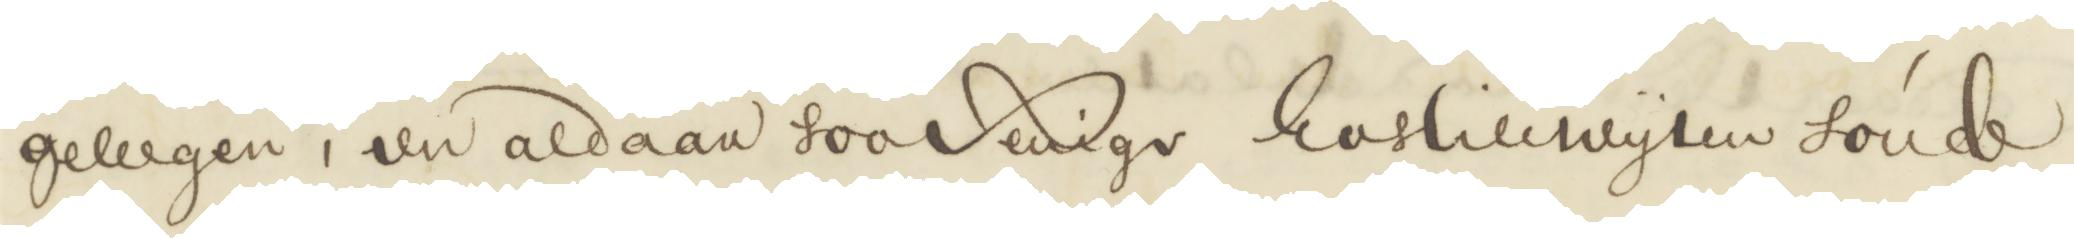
geleegen, en aldaar soo Eenige hostiliteijten soude
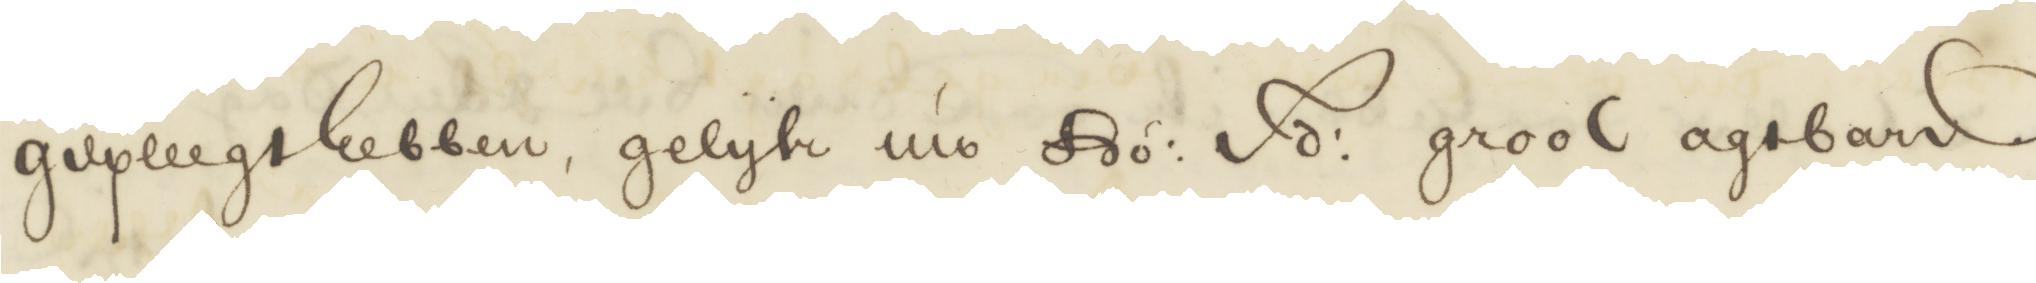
gepleegt hebben, gelijk uw Ho: Ed: groot agtbare
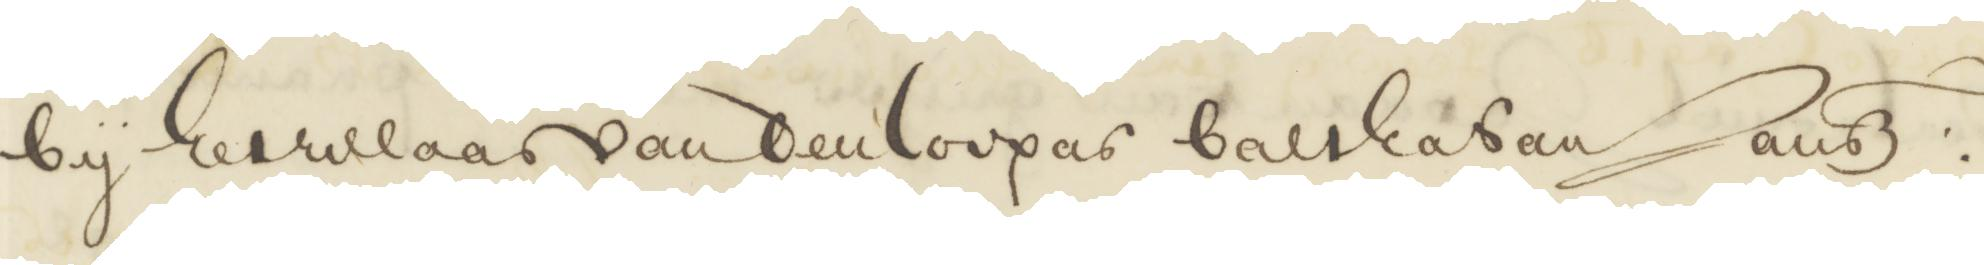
bij het relaas van den toepas balthasar Jans:
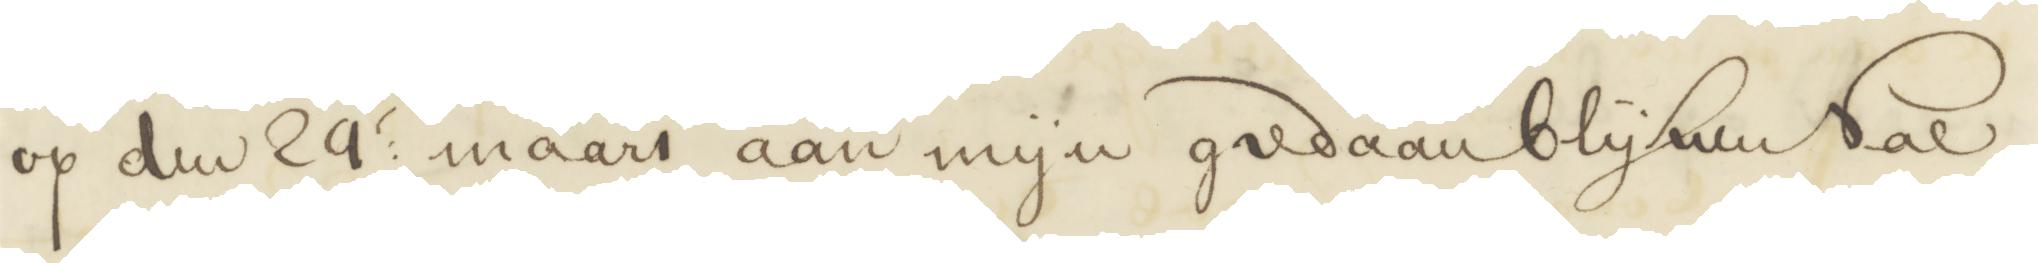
op den 24: maart aan mijn gedaan blijken Sal
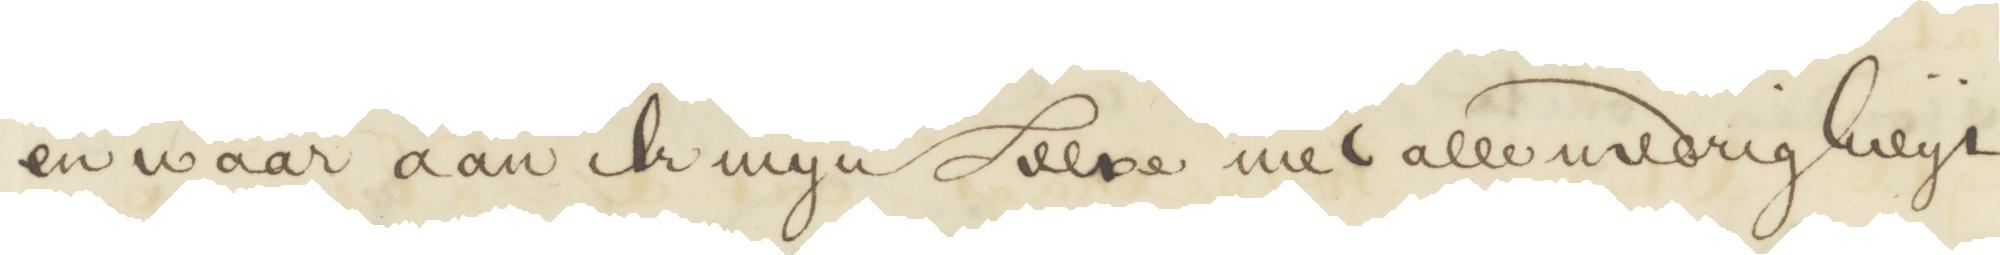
en waar aan ik mijn Selve met alle nedrigheijt
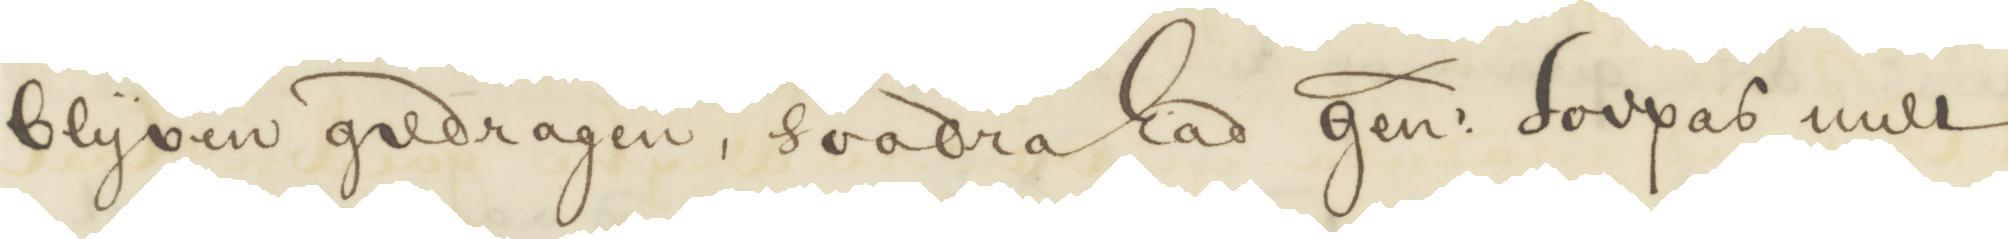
blijven gedragen, soodra had gen: toepas met
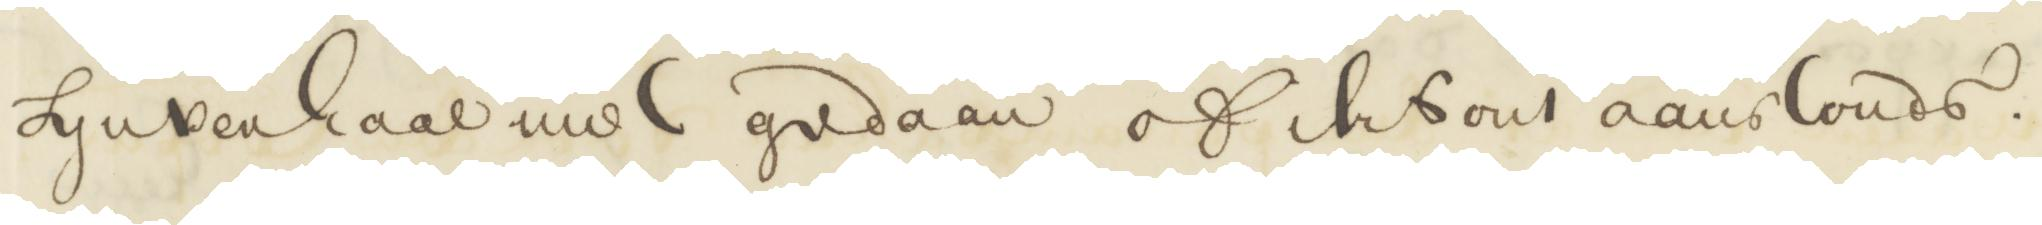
sijn verhaal niet gedaan of ik sont aanstonds.
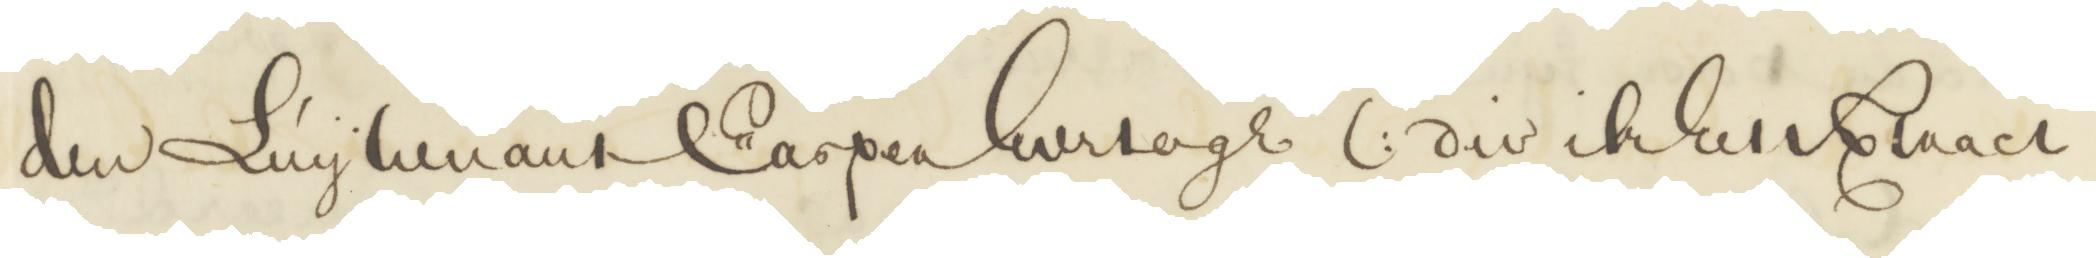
den Luijtenant Casper hertogh (:die ik het Extract
